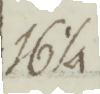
16¼
